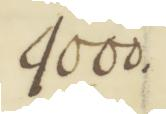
4000.
